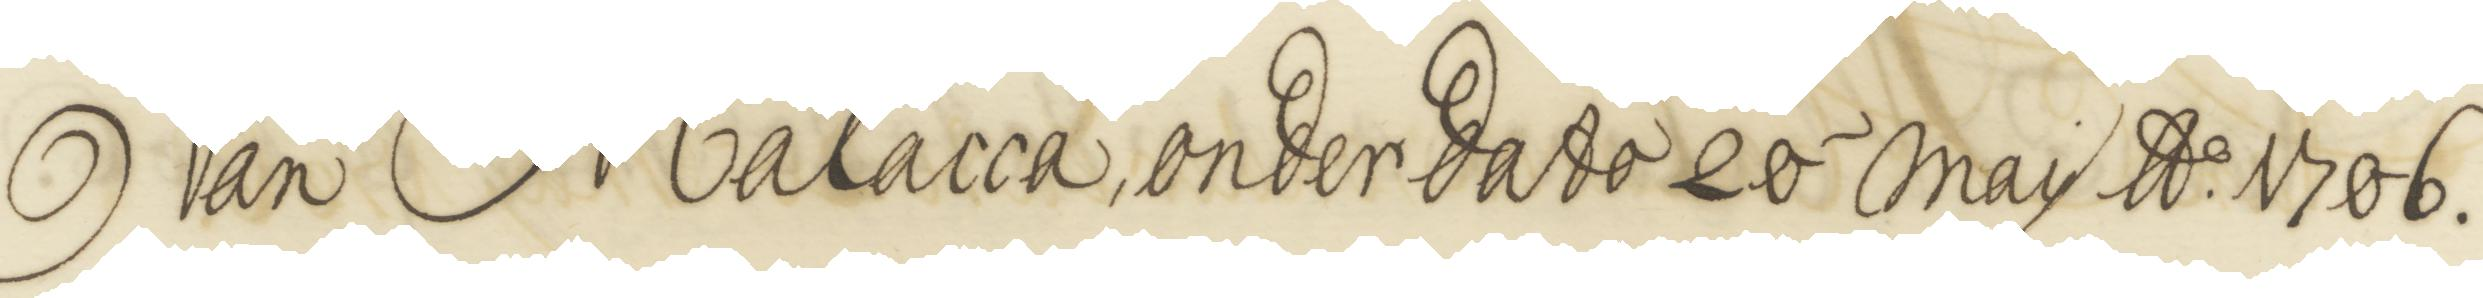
Van Malacca, onder dato 20' Maij A.o 1706.
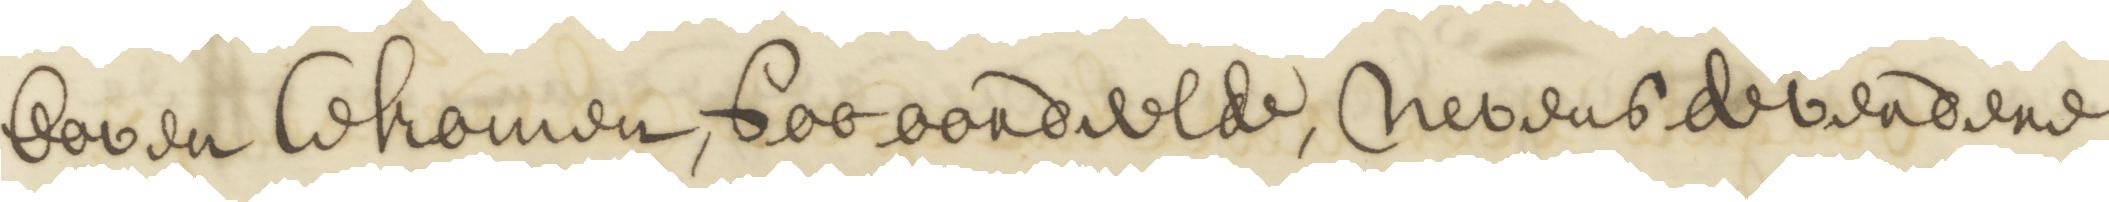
boven tekomen, soo oordeelde, nevens de verdere
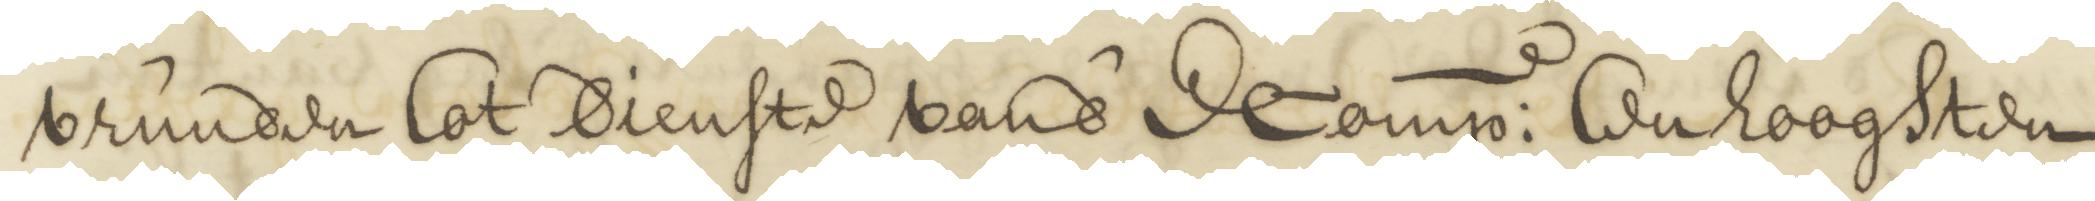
vrunden tot dienste van d’ E Comp:e ten hoogsten
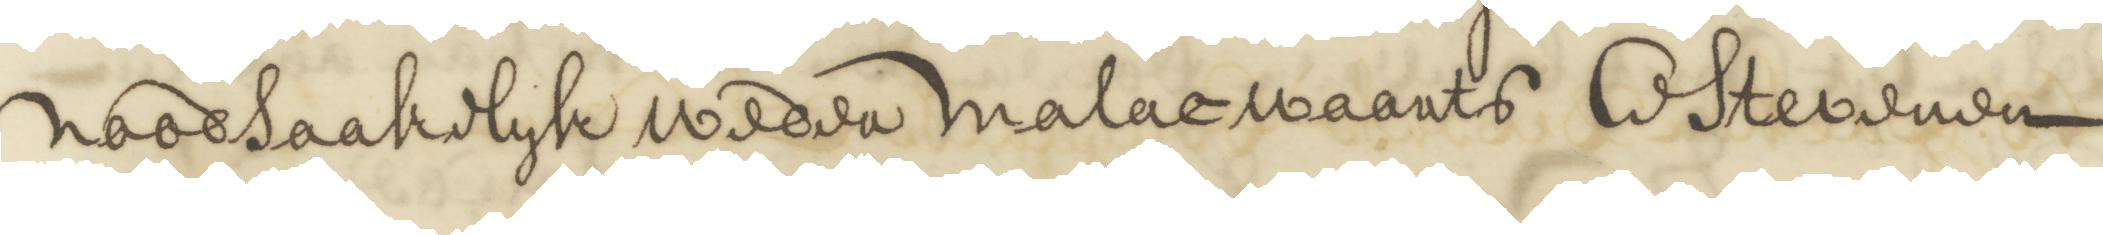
noodsaakelijk weder malacwaarts te stevenen,
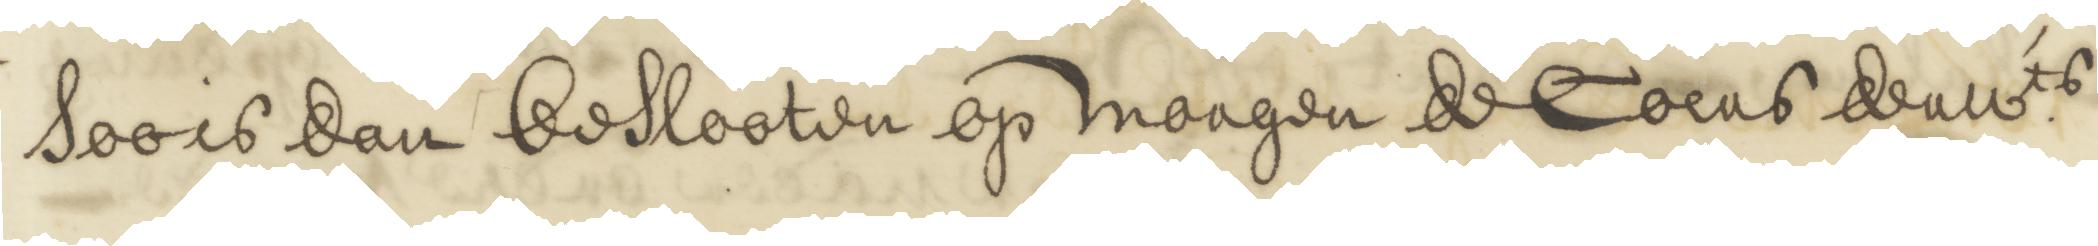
soo is dan beslooten op morgen de Coers derw.ts
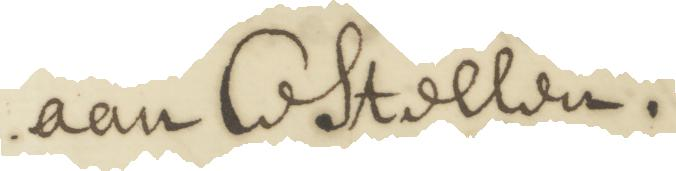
aan te stellen.
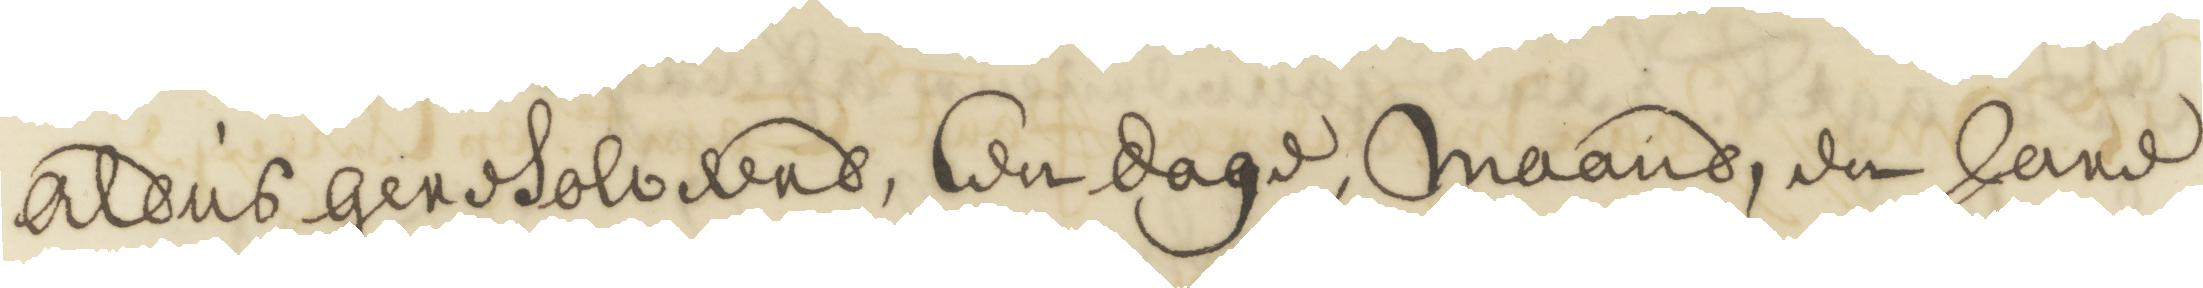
Aldus geresolveerd, ten dage, maand, en Jare
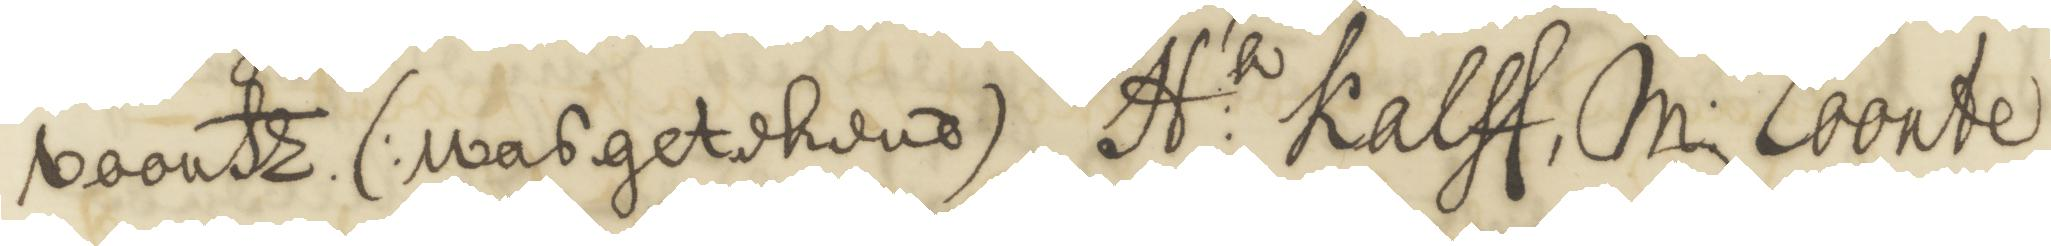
voorsz. (:was getekend) H:k kalff, M: Coorte
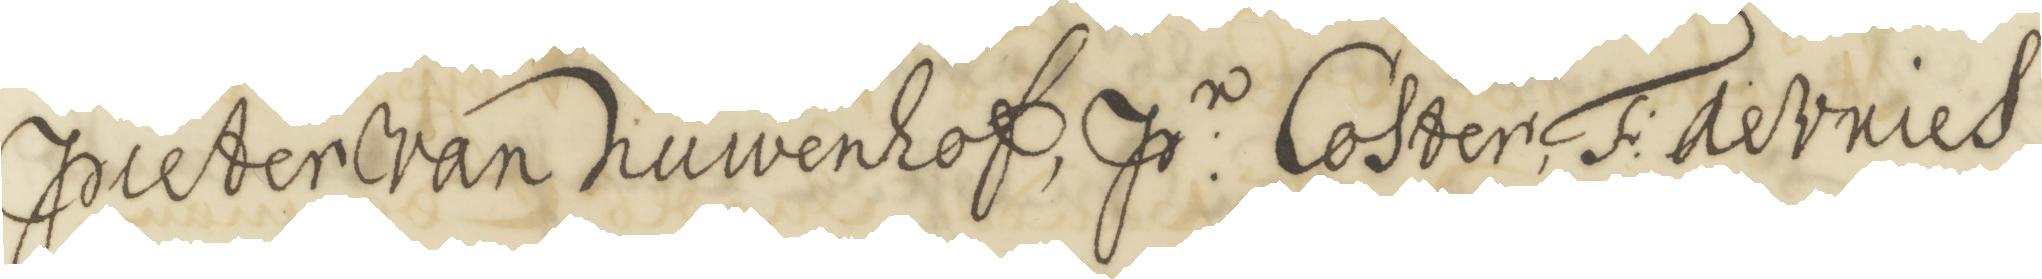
Pieter van nuwenhof, P:r Coster, F: devries
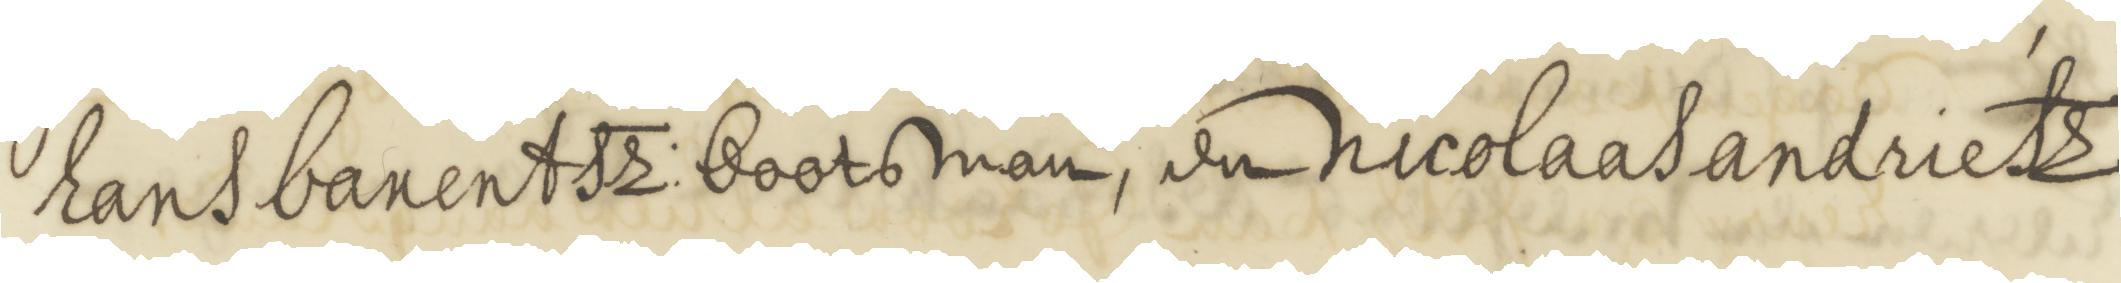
hans barentsz: boorsman, en Nicolaas andriesz
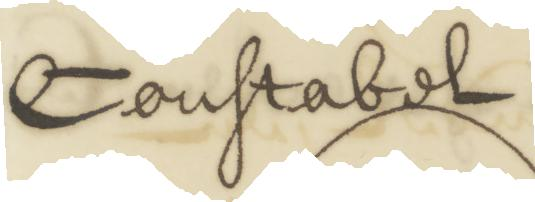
Constabel.
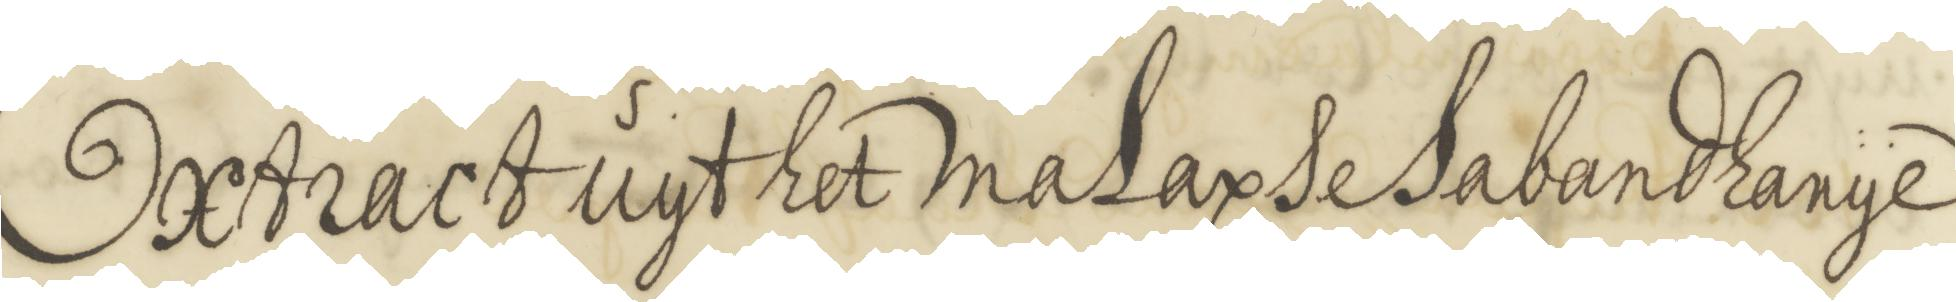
Extract uijt het malaxse Sabandharije
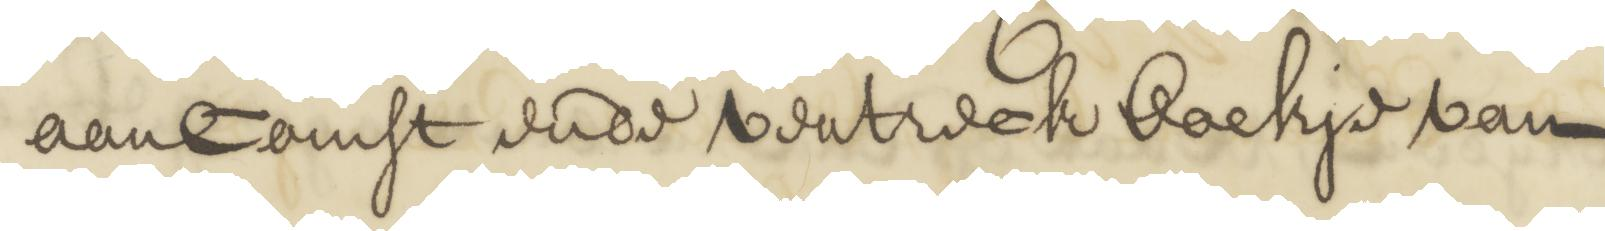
aancomst ende vertreck boekje van
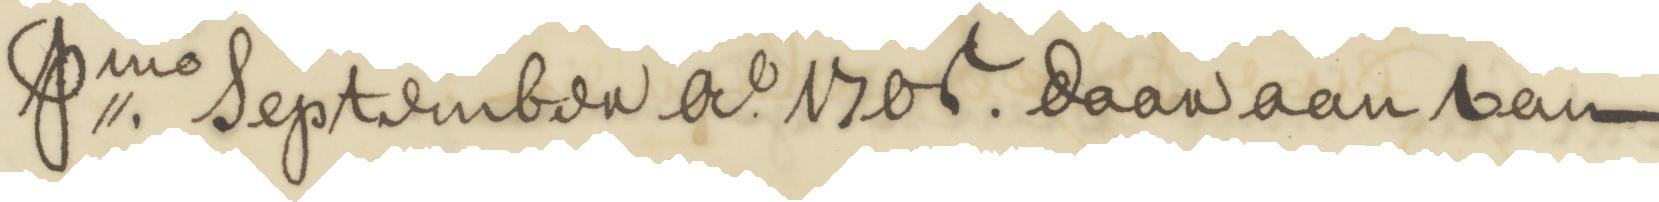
P„.mo september a.o 1705. daar aan van
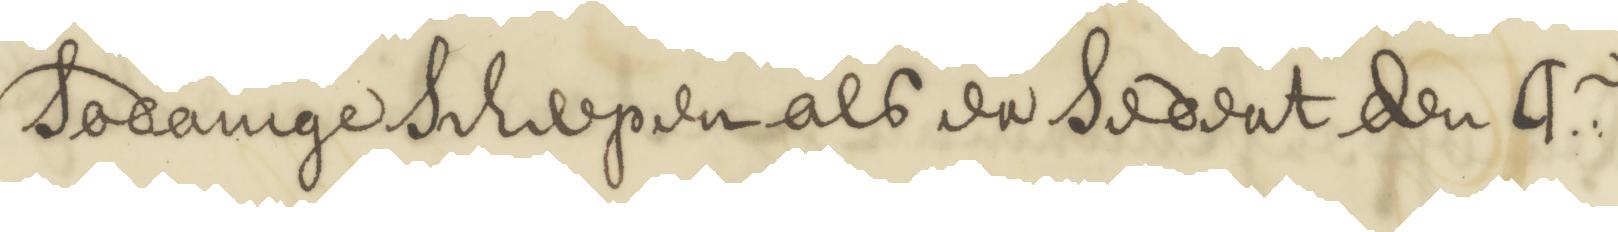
sodanige scheepen als er sedert den 4.'
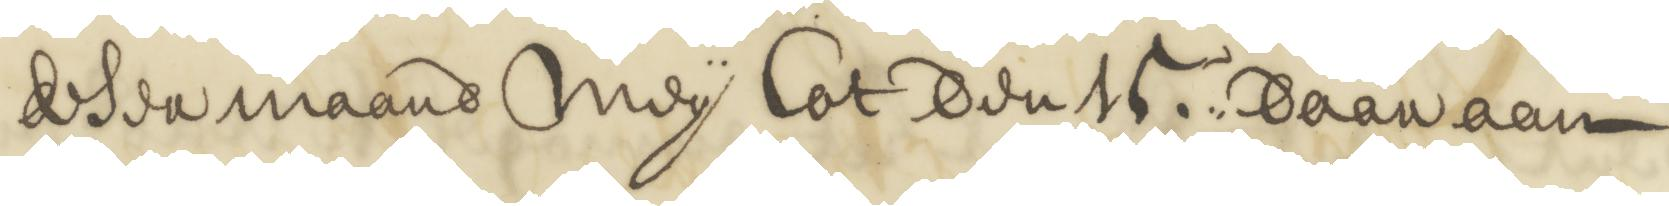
deser maand meij tot den 15.„' daar aan
